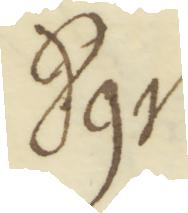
891
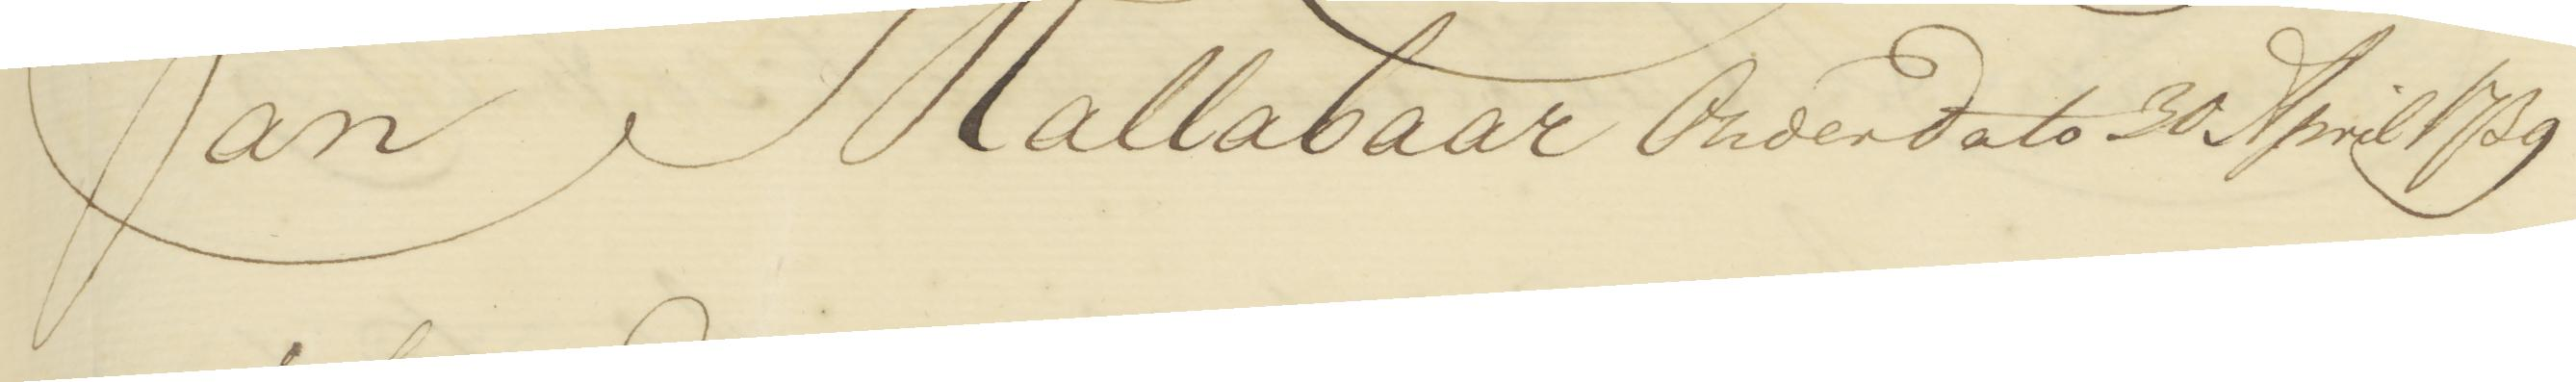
Van Mallabaar Onder dato 30 April 1739
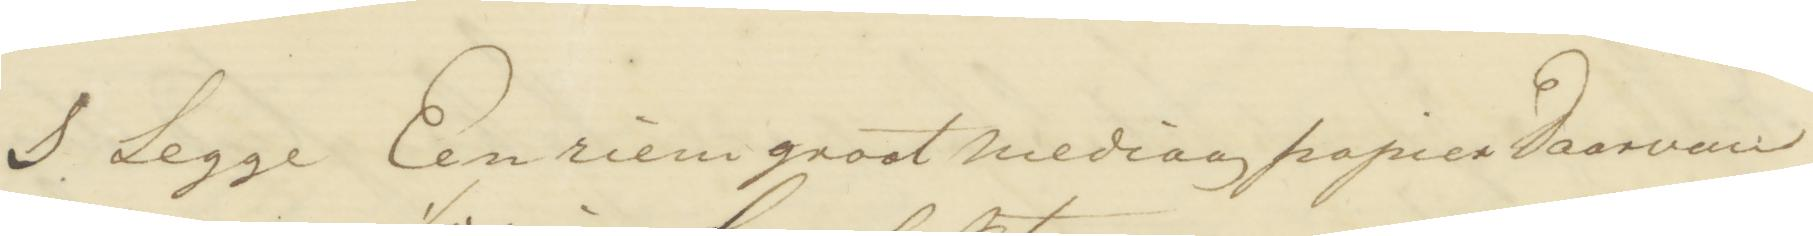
1 segge Een riem groot mediaan papier daarvan
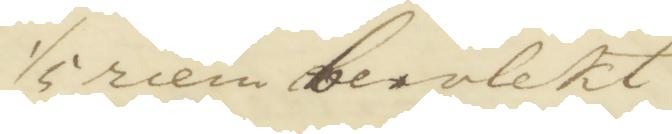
1/5 riem bervlekt
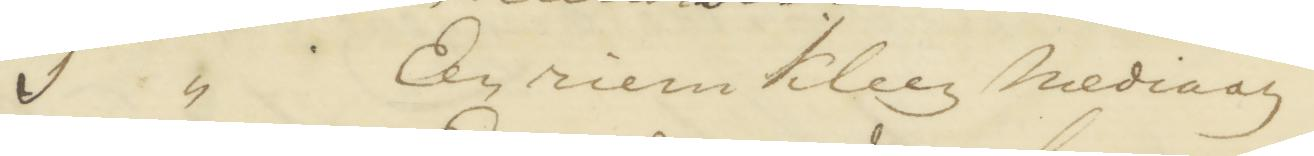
1 „ Een riem kleen mediaan
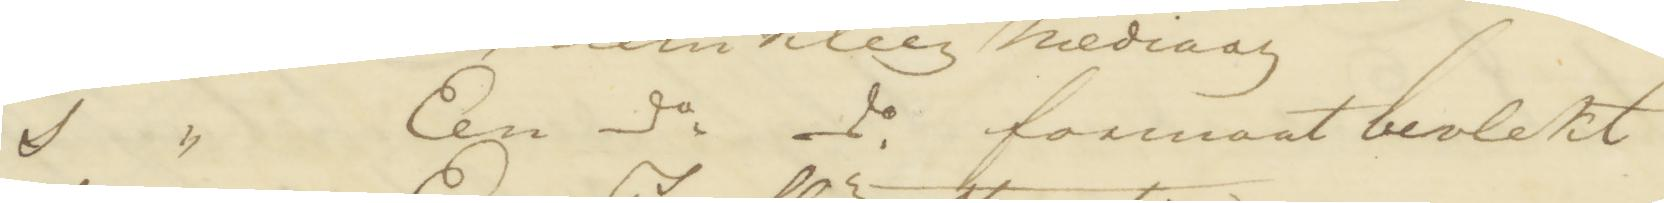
1 „ Een d„o d,o formaat bevlekt
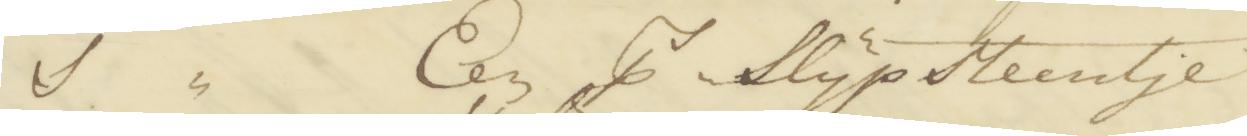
1 „ Een ps slijpsteentje
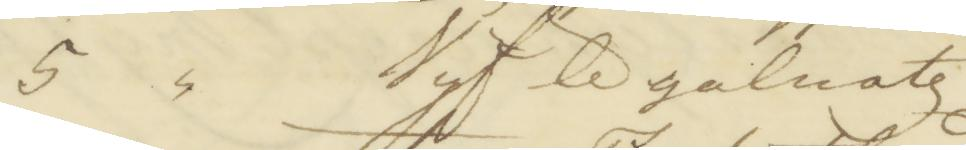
5 „ Vijf lb galnoten
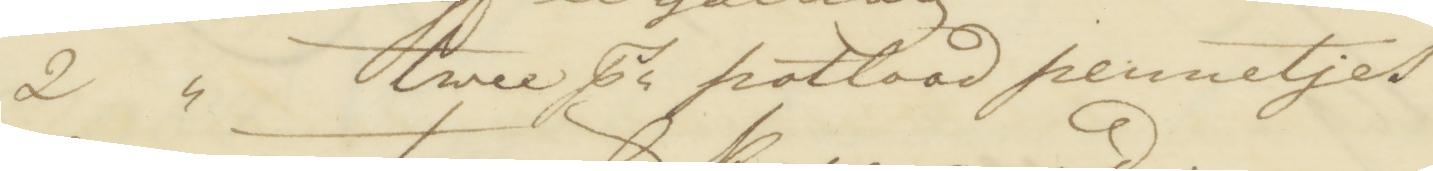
2 „ twee p„s potlood pennetjes
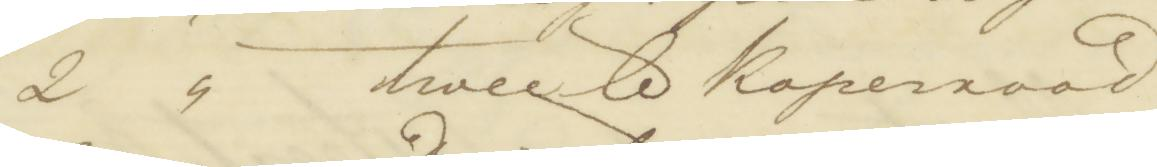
2 „ twee lb koperrood
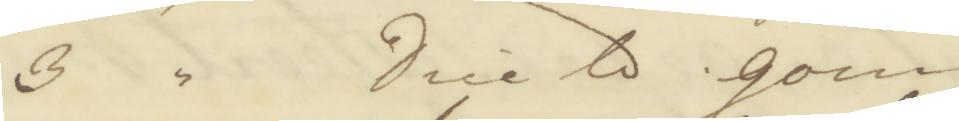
3 „ drie lb gom
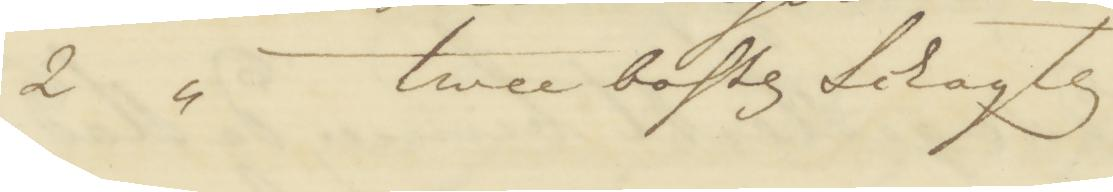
2 „ twee bosten schagten
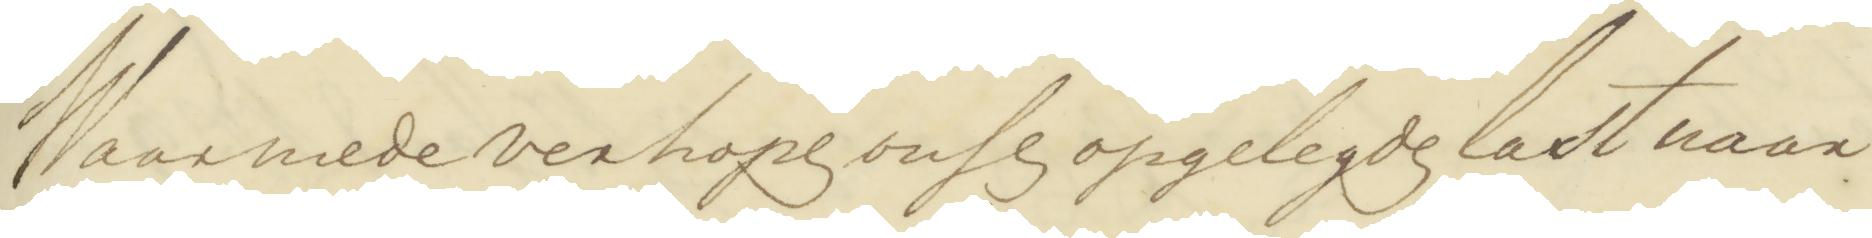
Waarmede verhopen onsen opgelegden last naar
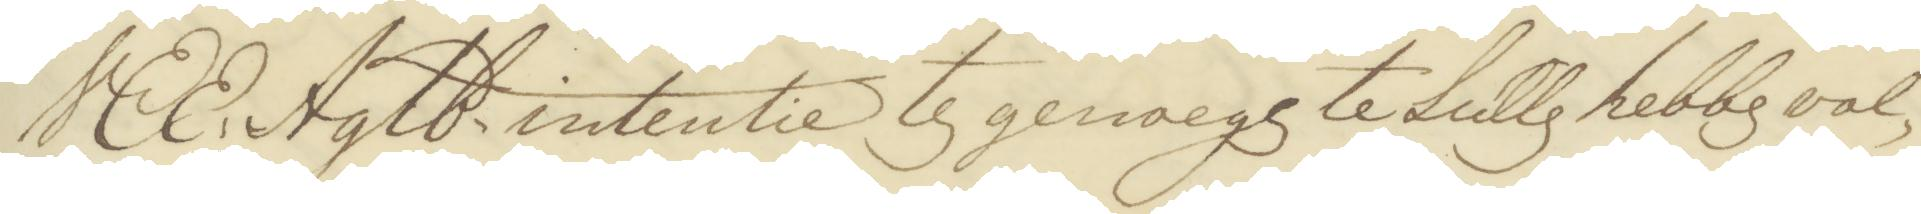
VEE: Agtb- intentie ten genoegen te sullen hebben vol,
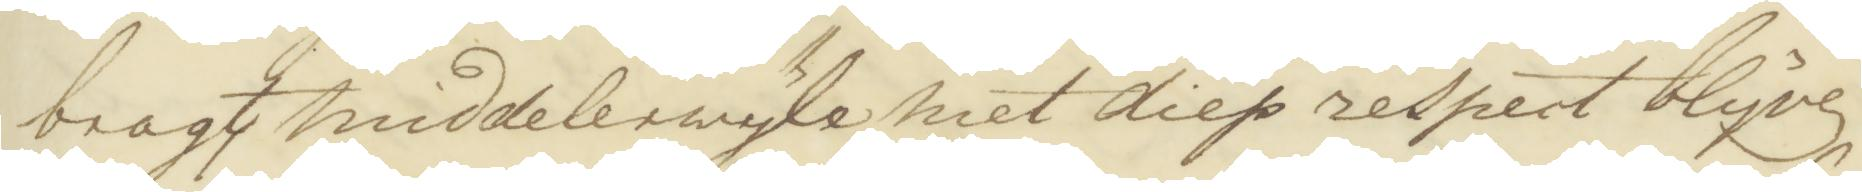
bragt middelerwijle met diep respect blijven
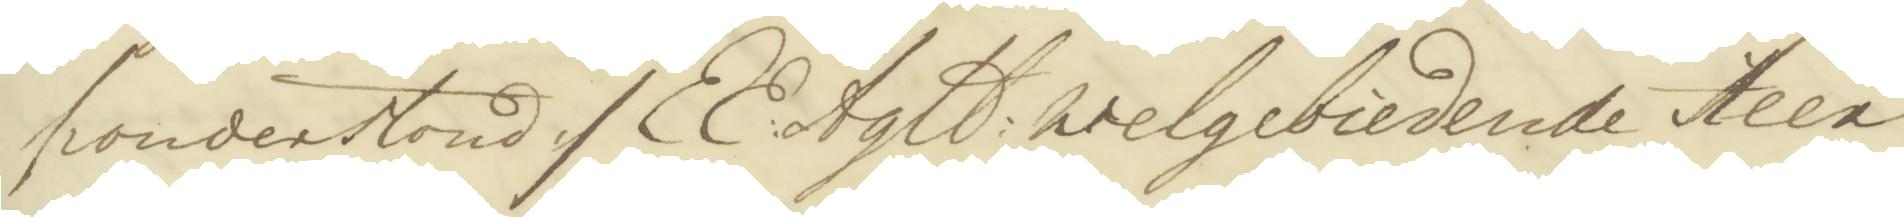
/onderstond:/ EE: Agtb: welgebiedende Heer
